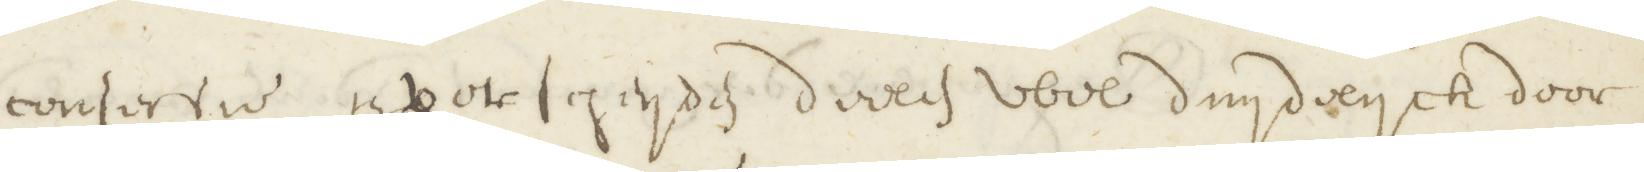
confessie is vor scheyden deelen wel duydelyck door
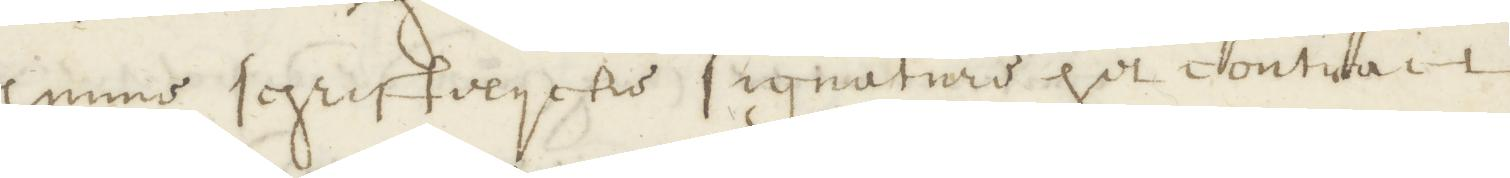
hunne schriffelycke signature het contract
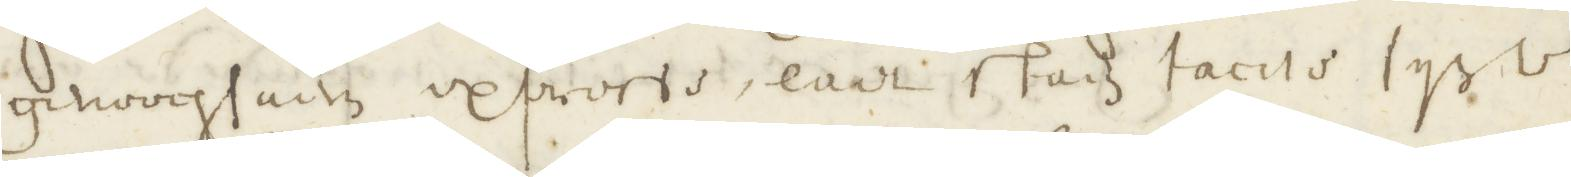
genoochsaem expresse, laet staen tacite syn
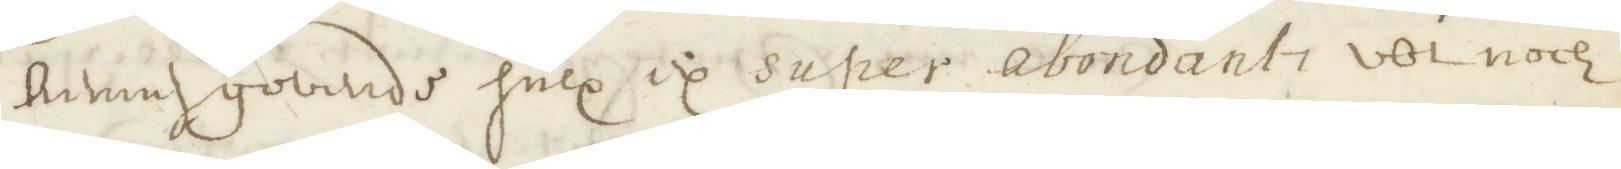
kennen gevende sulx ex super abondanti wt noch
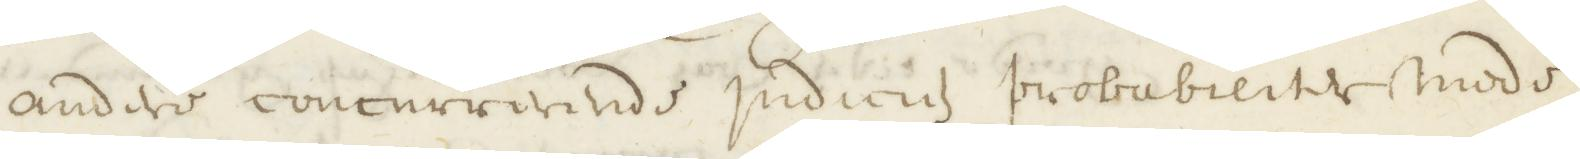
andere concurrerende Jndicien probabiliter mede
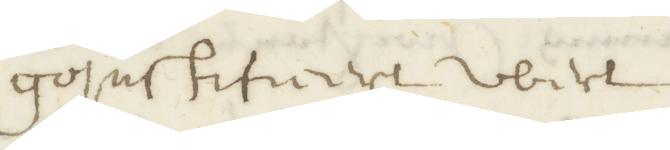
gejustitieert wert
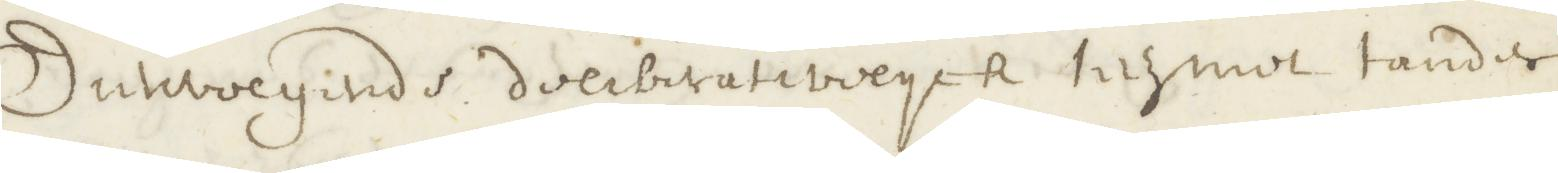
En wegends delibirativelyck teen met tander
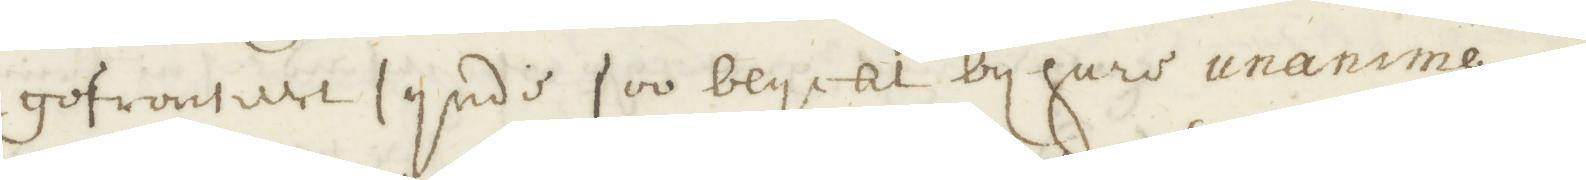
gefronteert synde soo blyckt by hare unanime —
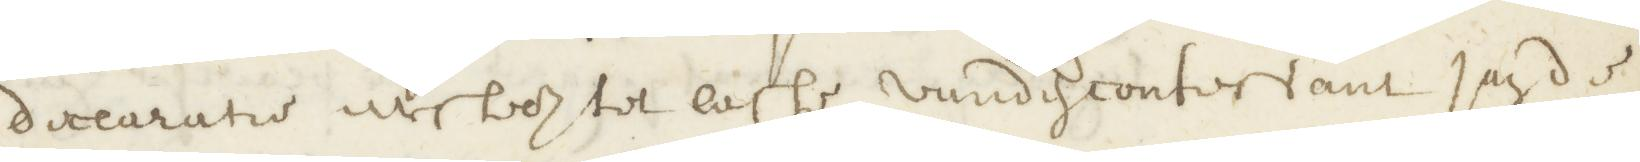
declaratie metlos tot laste van den confessant jan de
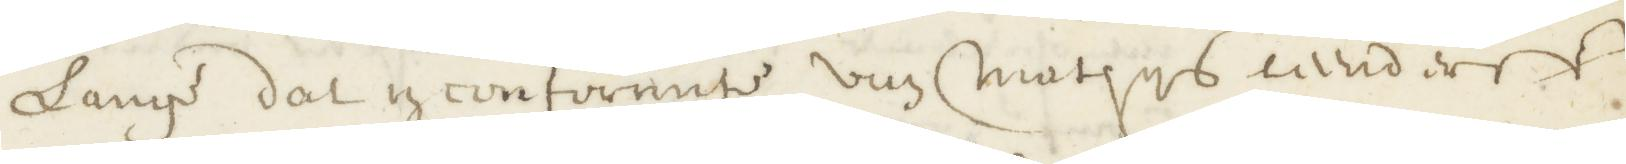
Lange dat in conformite van mathys leenderts
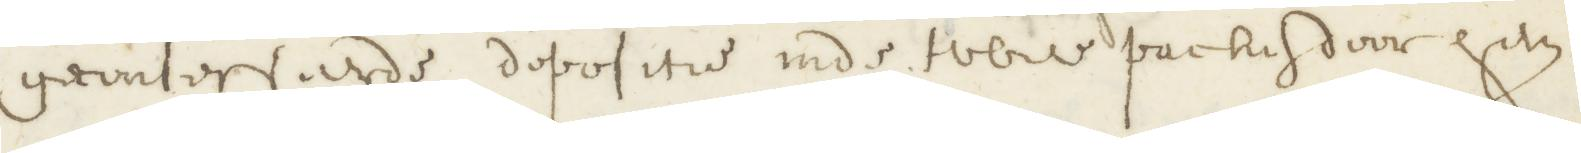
gecontesteerde depositie inde twee packen door hem
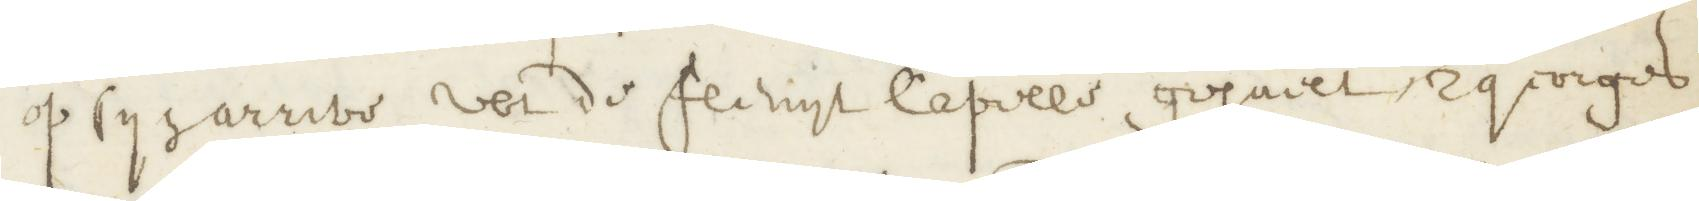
op syn arrive wt de fleuyt Capelle gehaelt, 29 corges
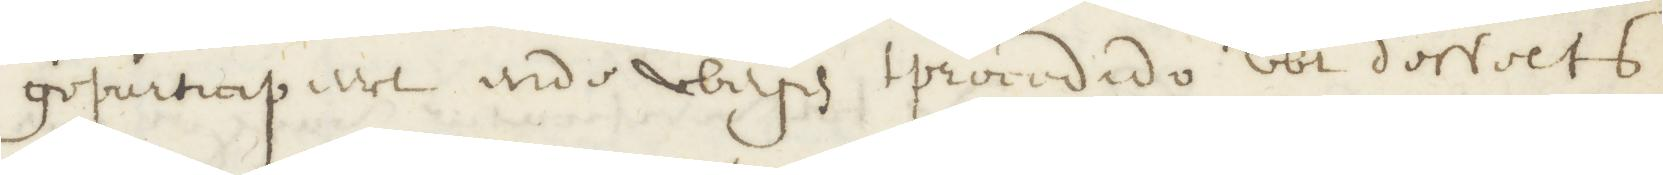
geparticipeert ende wegen tprocedido wt desselfs
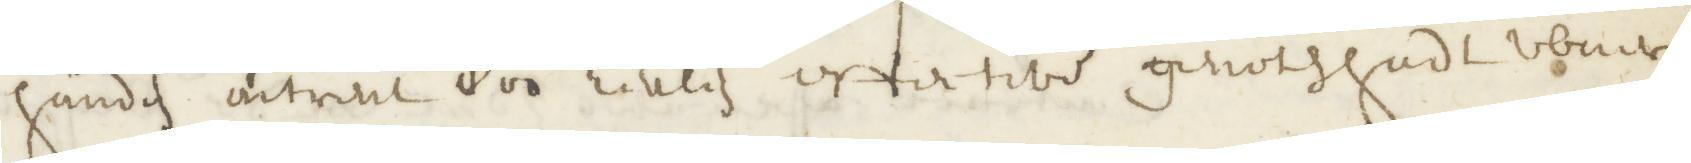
handen ontrent 800 henlie effective genoten hadt waer
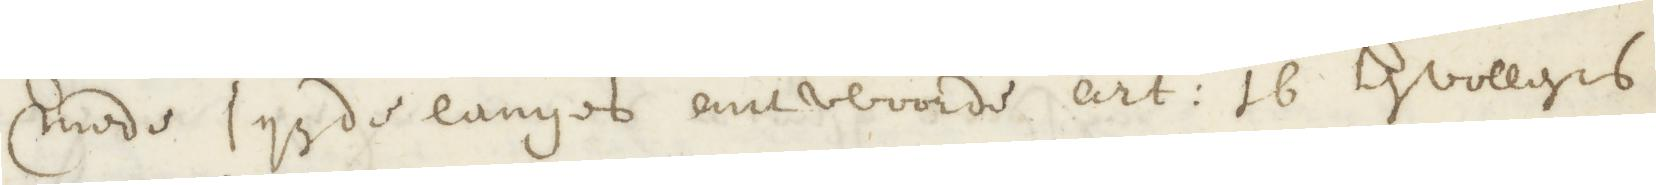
mede synde langes antwoorde art: 16 tenvollen is
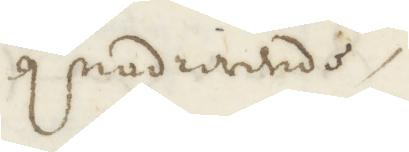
quadrerende,
